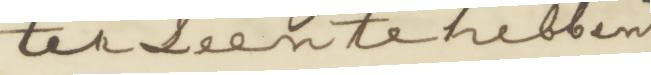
ter Leen te hebben
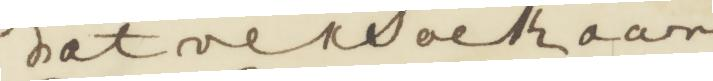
dat versoek aan
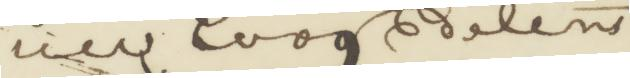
uw hoog Edelens
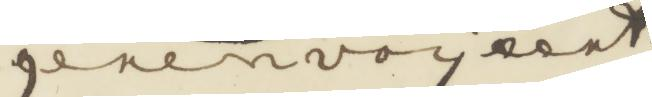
gerenvoijeert
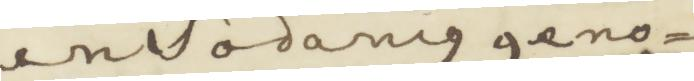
en sodanig geno„
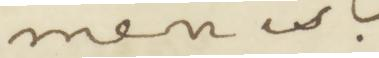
men is.
